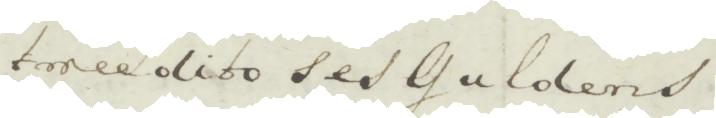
twee dito ses Guldens
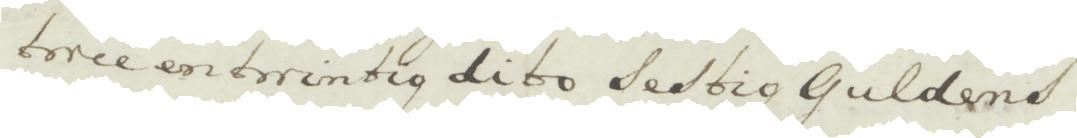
twee en twintig dito Sestig Guldens
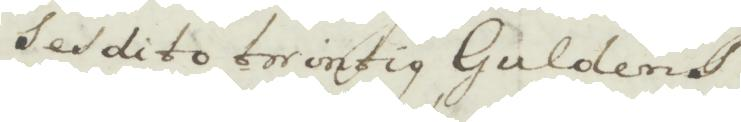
ses dito twintig Guldens
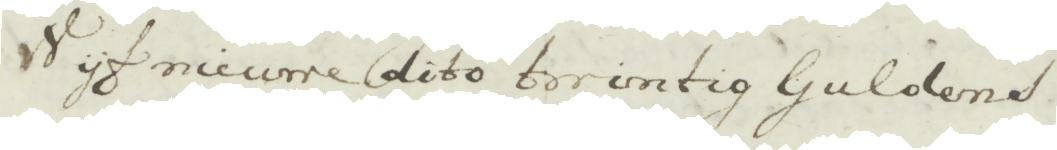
Vijf nieuwe dito twintig Guldens
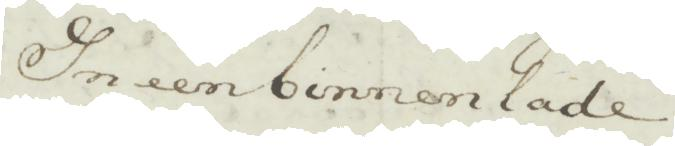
In een binnen lade
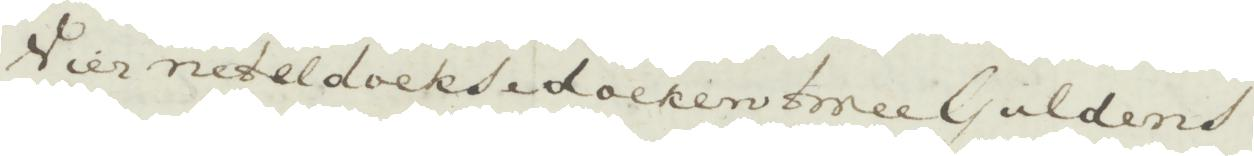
Vier neteldoekse doeken twee Guldens
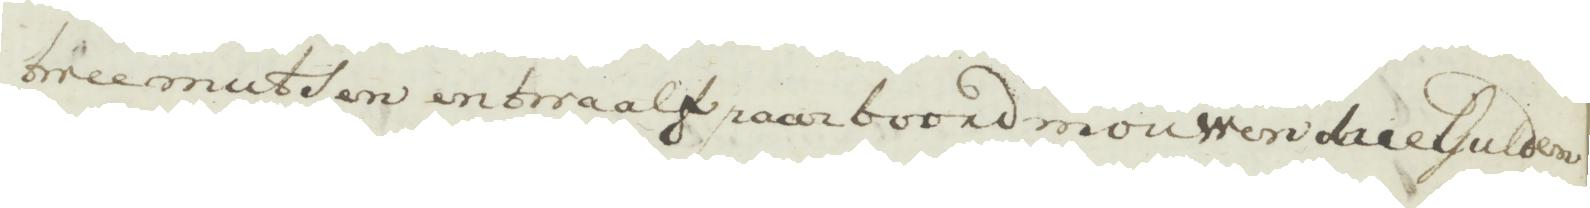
twee mutsen en twaalf paar boord mouwen drie Guldens
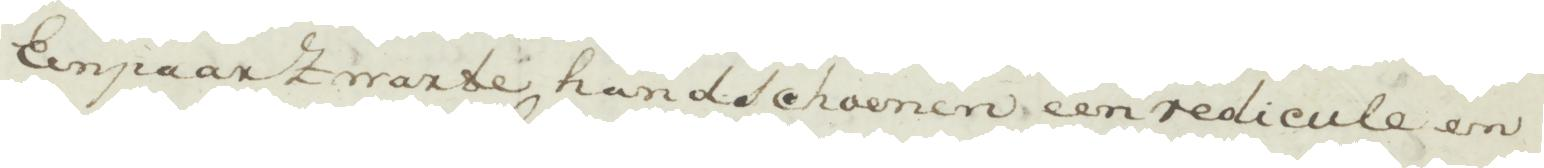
Een paar zwarte handschoenen, een redicule en
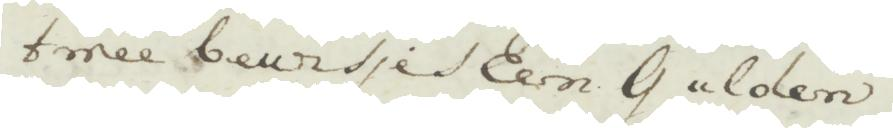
twee beursjes Een Gulden
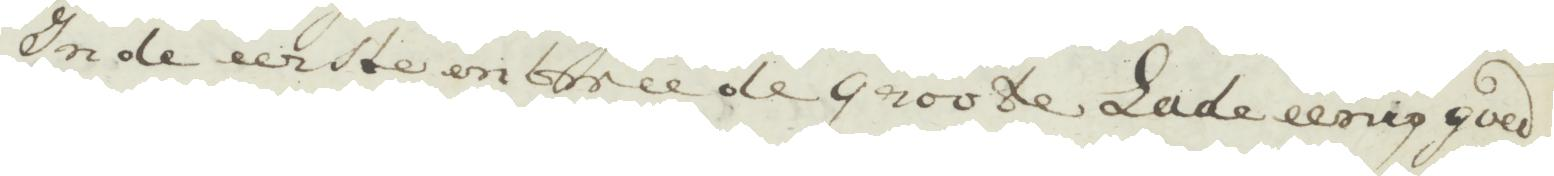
In de eerste en tweede groote Lade eenig goed
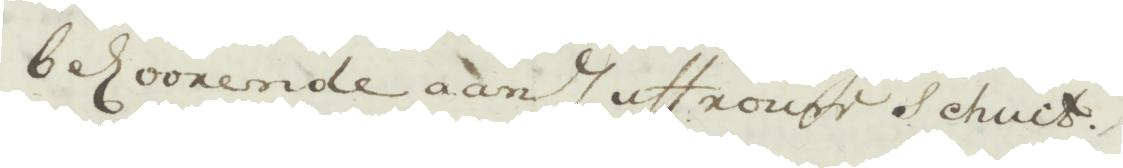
behoorende aan Juffrouw Schuit.
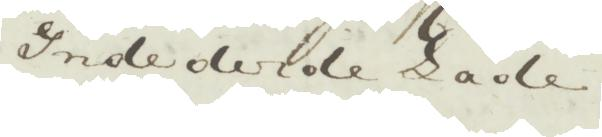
In de derde Lade
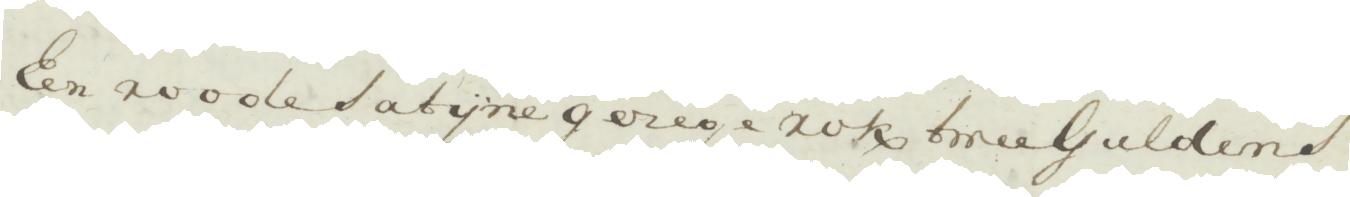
Een roode satijne gerege rok twee Guldens
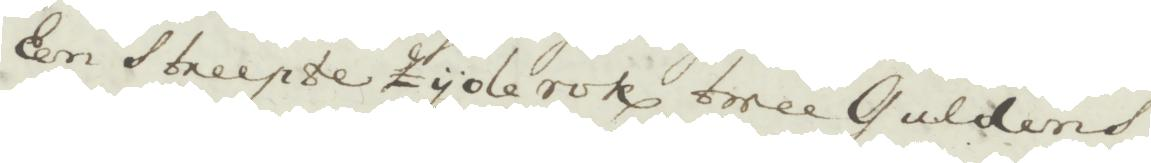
Een streepte Zijde rok twee Guldens
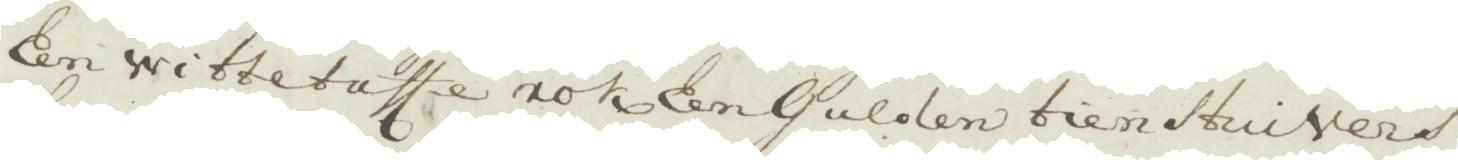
Een witte taffe rok Een Gulden tien stuivers
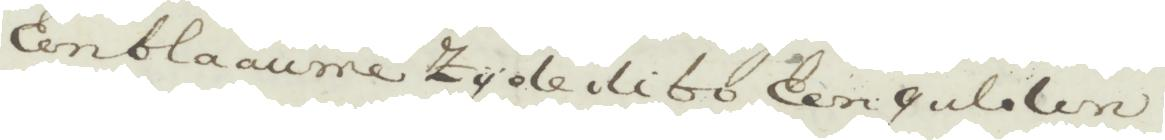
Een blaauwe zijde dito Een gulden
